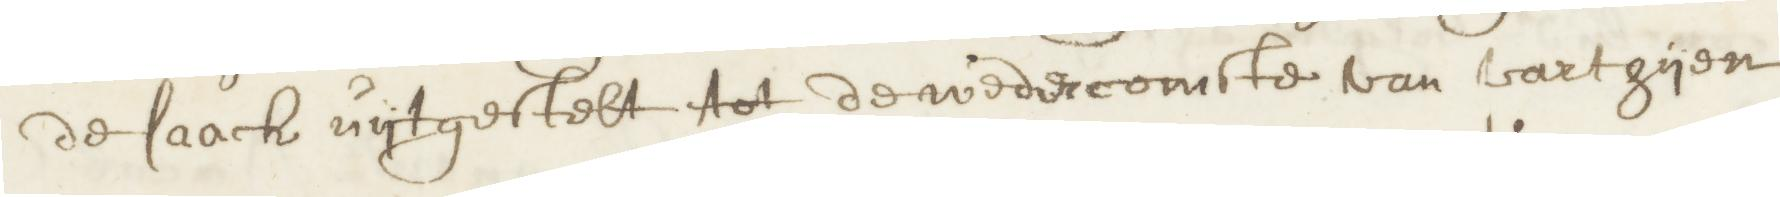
de saack uijtgestelt tot de wedercomste van parthijen
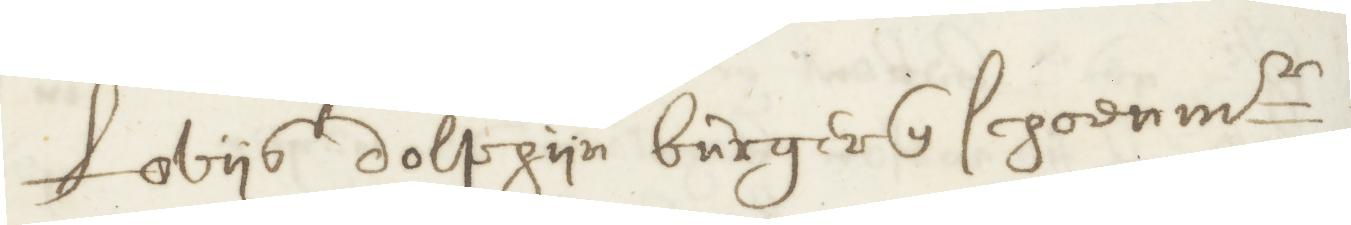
Lovijs dolphijn burger e schoenm=r
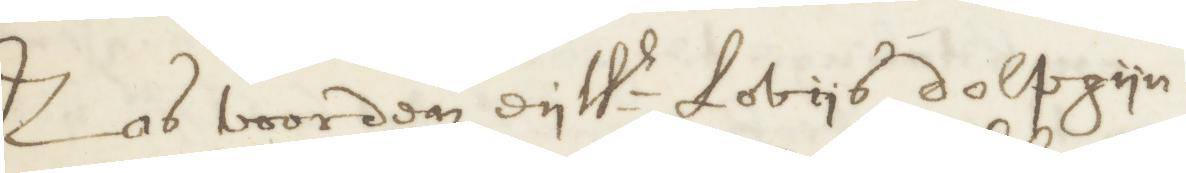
Zas voor den eijss=r Lovijs dolphijn
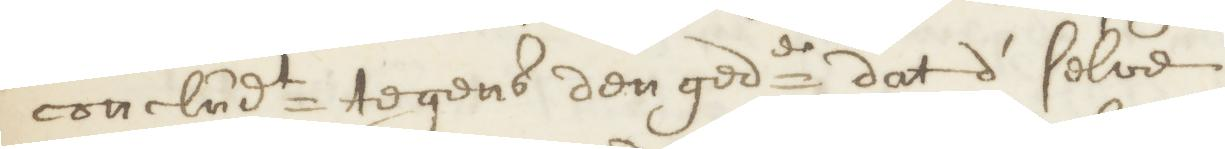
conclud=t tegens den ged=e dat d’ selve
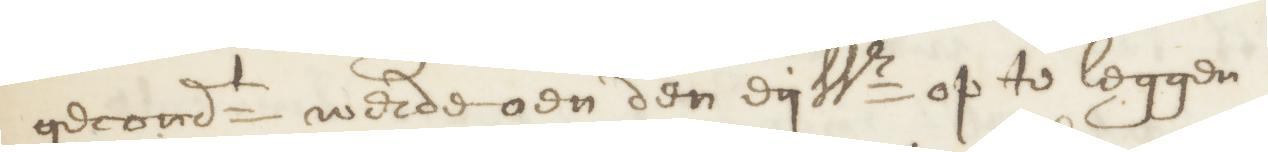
gecond=t werde aen den eijss=r op te leggen
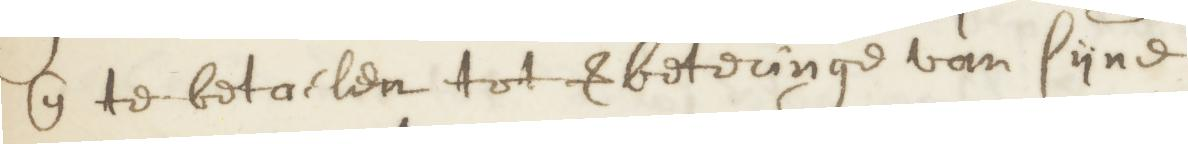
ende te betaelen tot verbeteringe van sijne
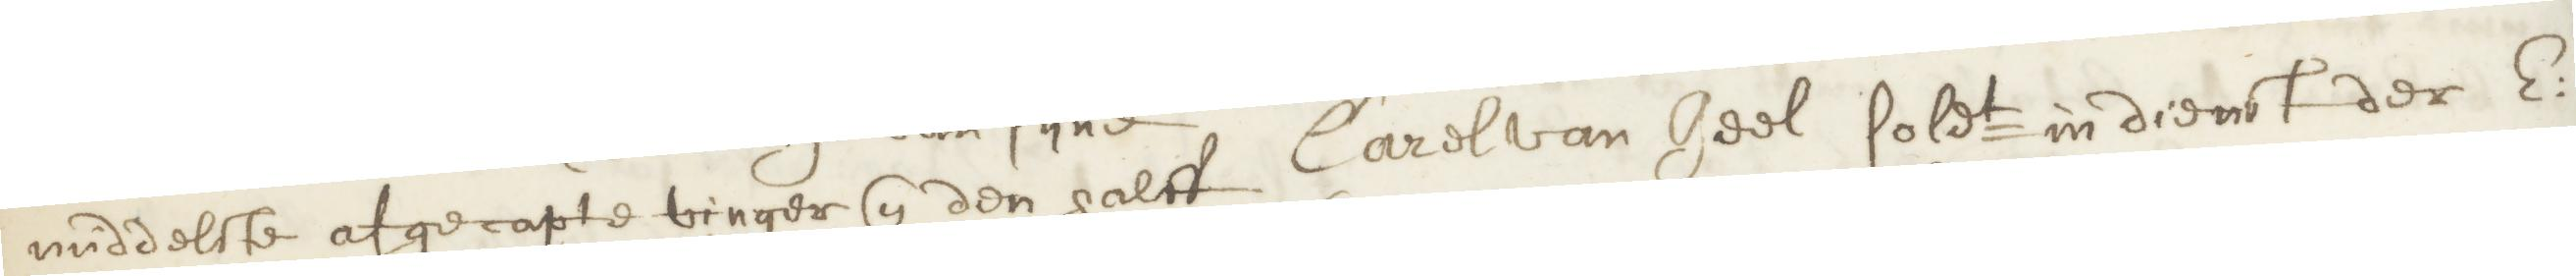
middelste afgecapte viner ende den halff Carel van Geel sold=t in dienst der E:
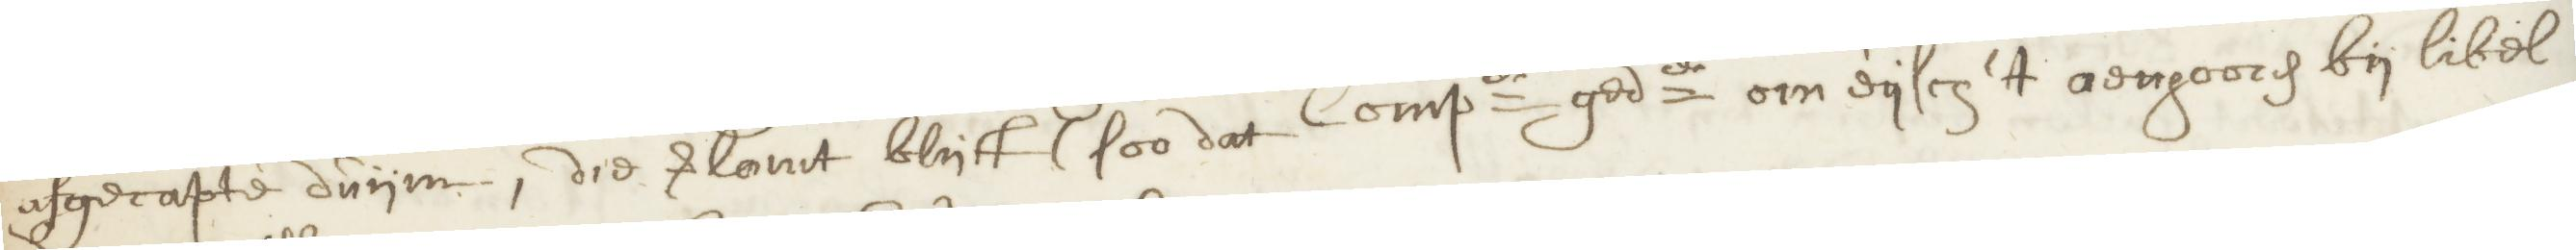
afgecapte duijm, die verlamt blijft (soo dat Comp=e ged=e om eijsch ’t aenhooren bij libel
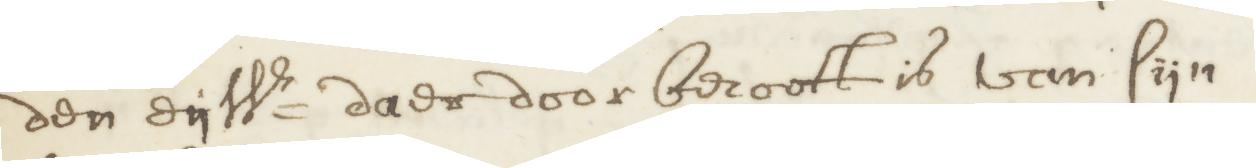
den eijss=r daer door berooft is van sijn
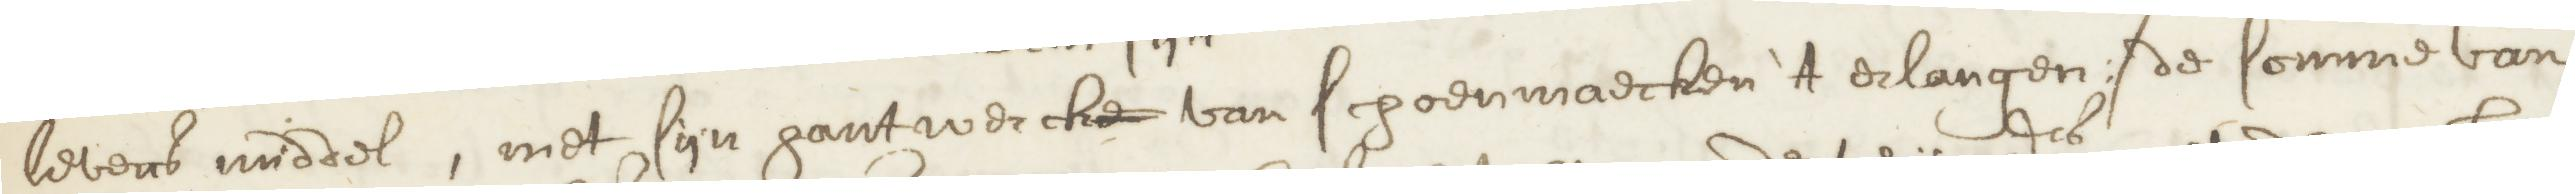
levens middel, met sijn hantwercke van schoenmaecken ’t erlangen:/ de somme van
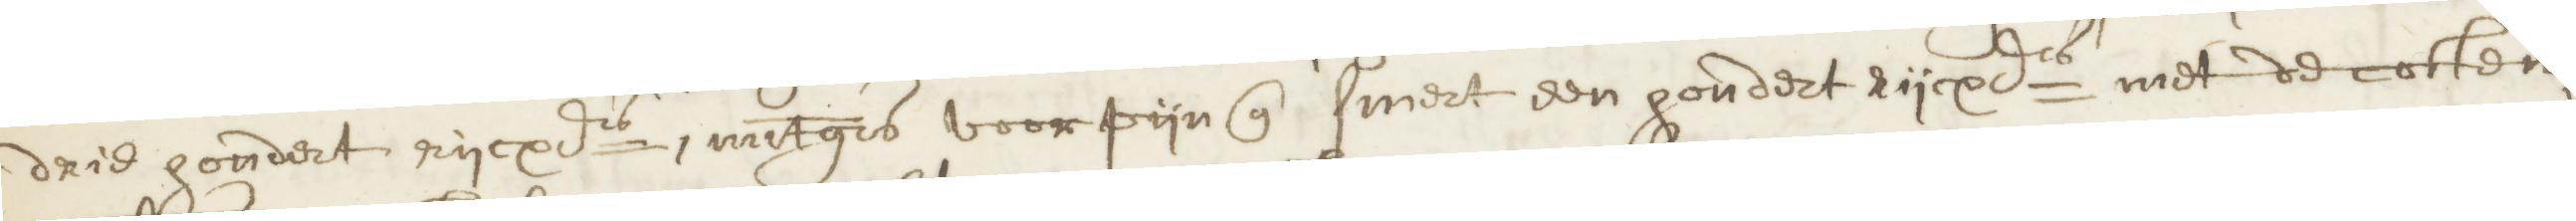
drie hondert rijcxd=rs, mitgrs voor pijn ende smert een hondert rijcxd=rs met de cassen
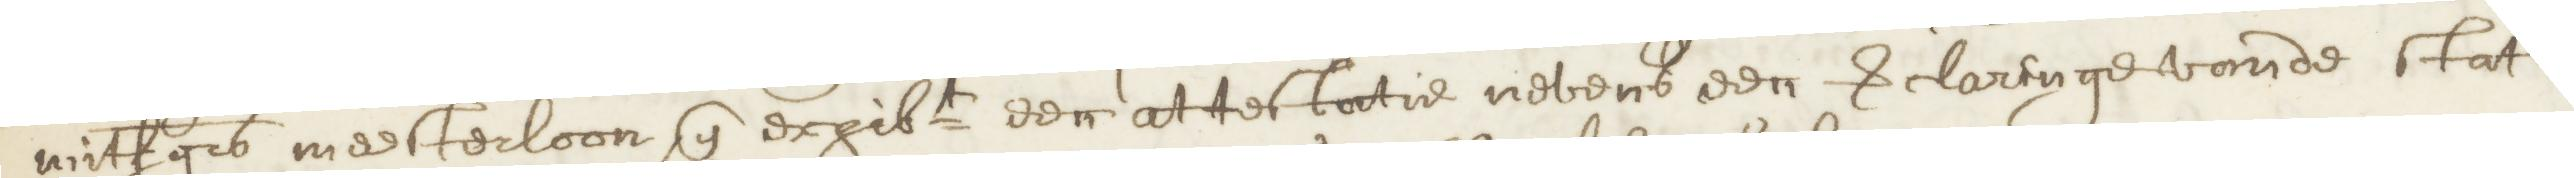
mitsgrs meesterloon ende exhib=t een attestatie nevens een verclaringe vande stats
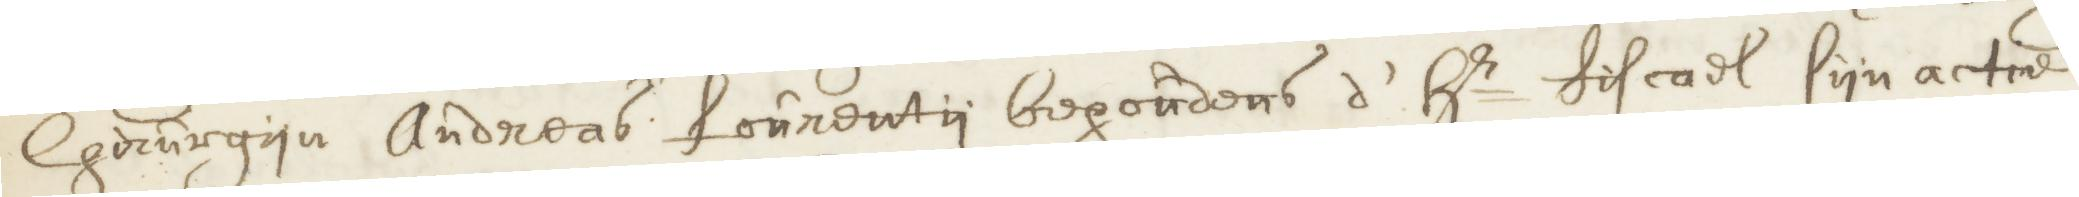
Chirurgijn Andreas Lourentij behoudens d’ H=r fiscael sijn actie
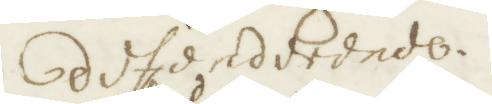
desen aderendo.
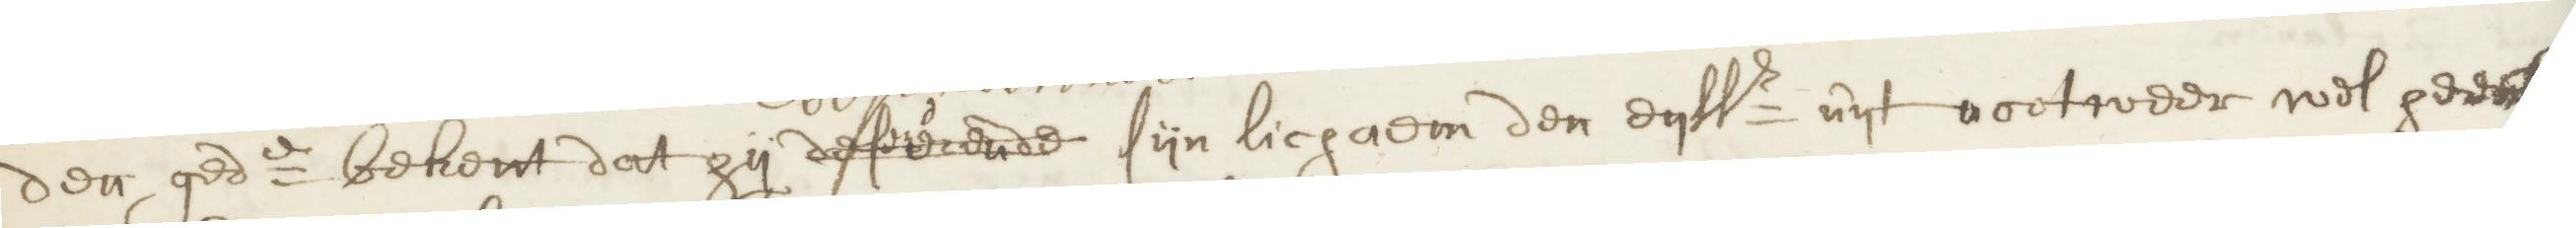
den ged=e bekent dat hij deserende sijn lichaem den eyss=r uyt nootweer wel heeft
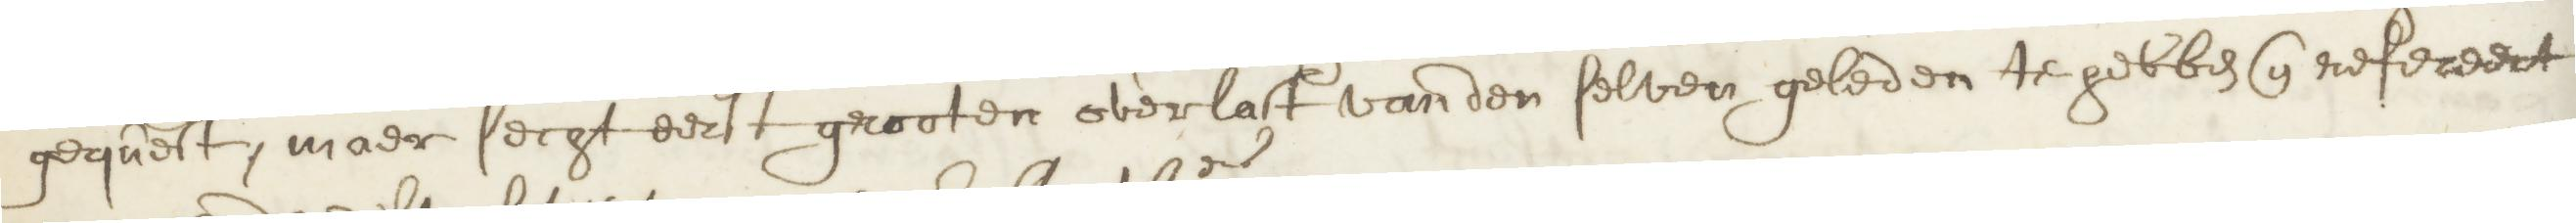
gequest, maer secht eerst grooten overlast van den selven geleden te hebben ende refereert
